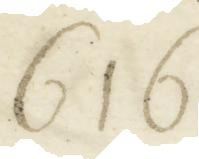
616
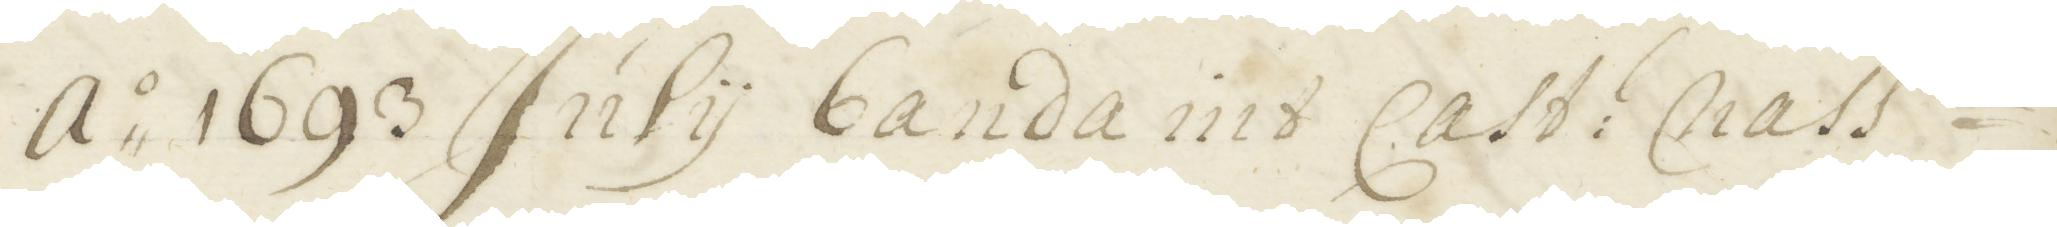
A„o 1693 Julij banda int Cast:l nass=w
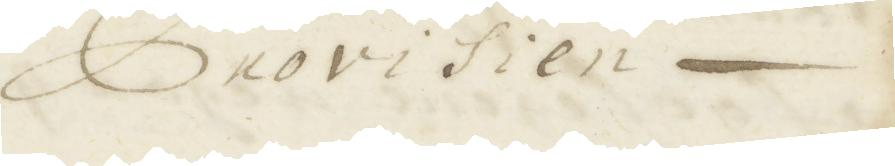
Provisien —
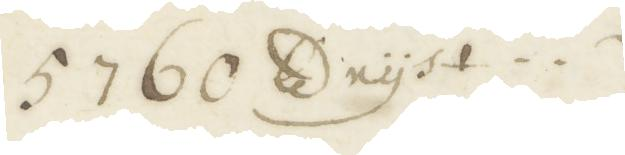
5760 lb rijst - -
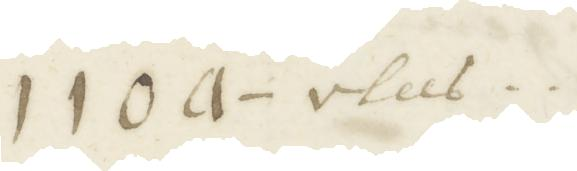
1104 - vlees - -
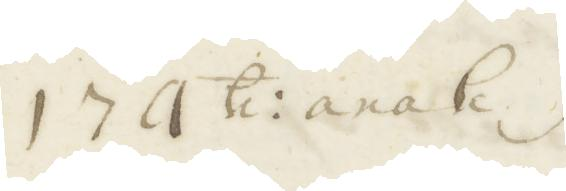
174 k: arak
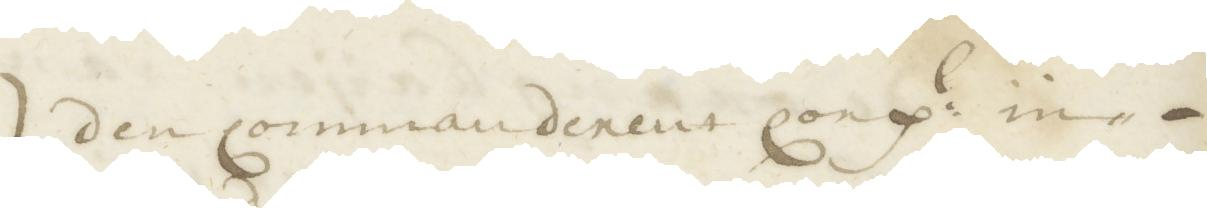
den commanderent corp:l in„ —
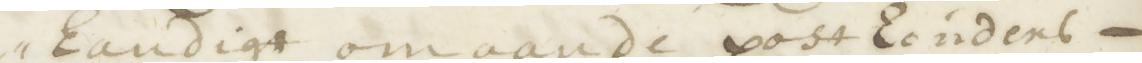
„handigt om aan de post houders —
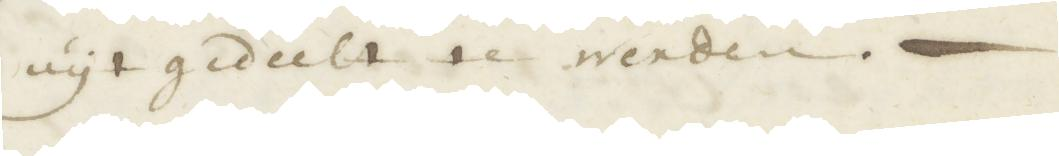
uijt gedeelt te werden. —
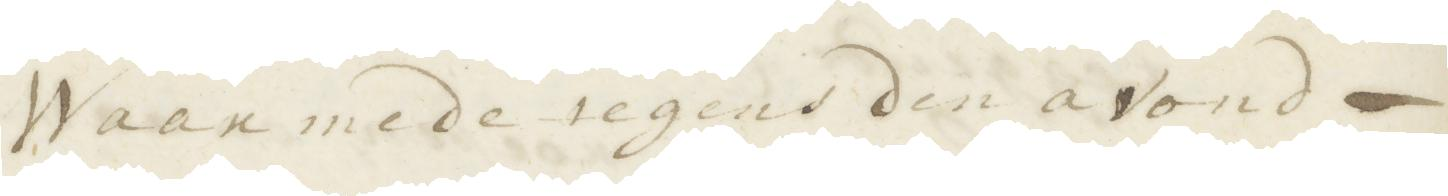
Waar mede tegens den avond —
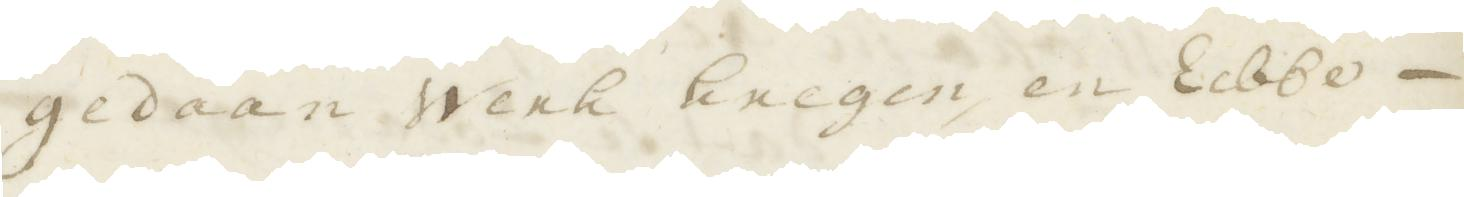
gedaan werk kregen, en hebbe —
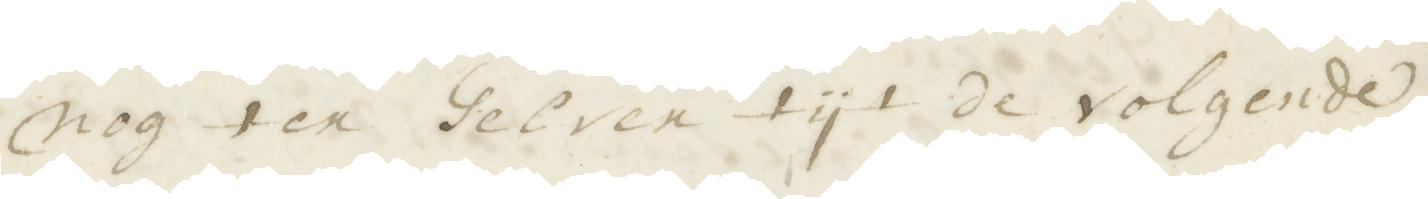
nog ter selver tijt de volgende
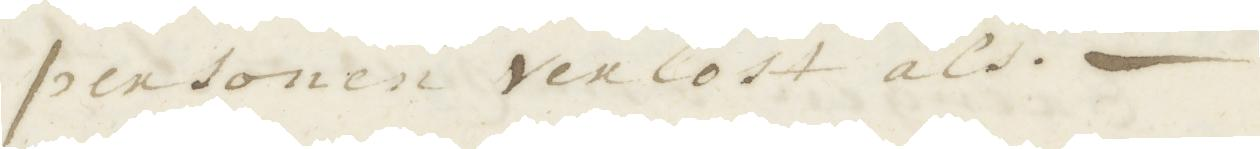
personen verlost als. —
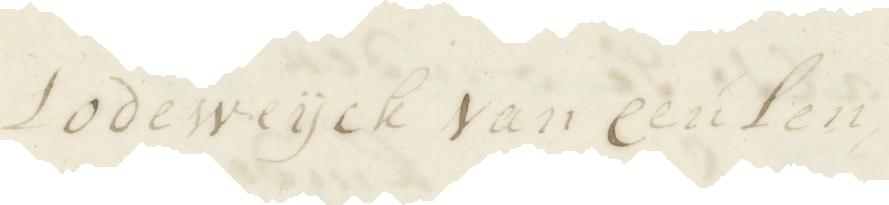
lodeweijck van ceulen
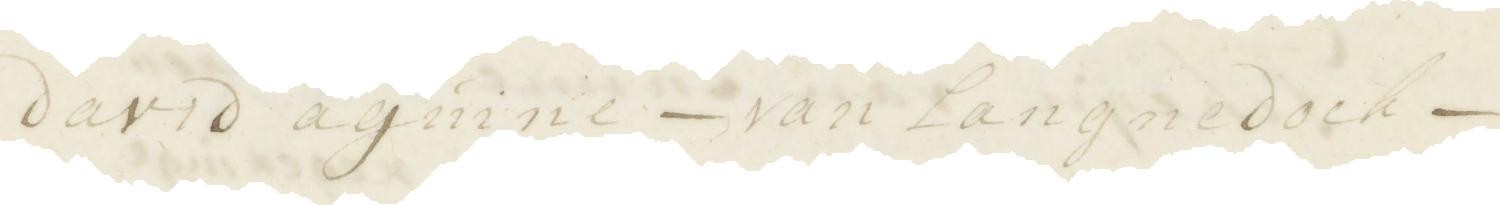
david aguine — van langnedock —
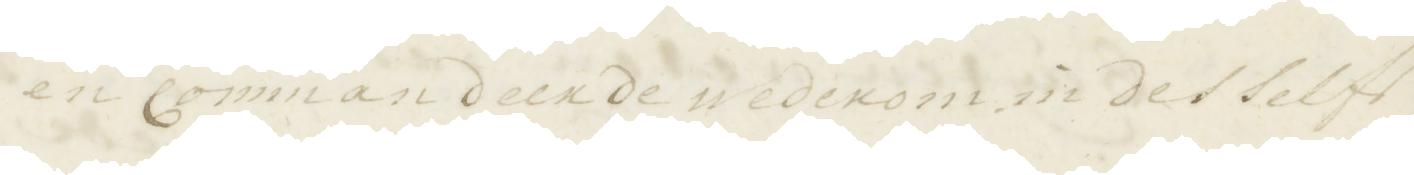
en commandeerde wederom in desselfs
